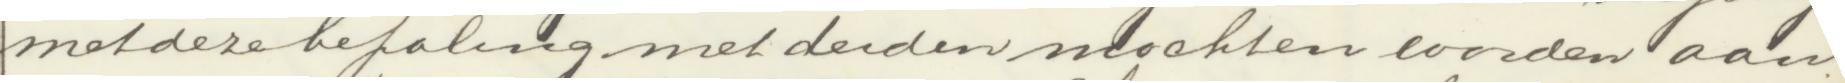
met deze betaling met derden mochten worden aan
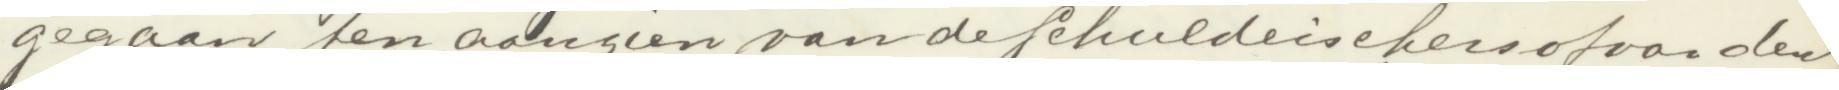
gegaan, ten aanzien van de schuldeischers of van den
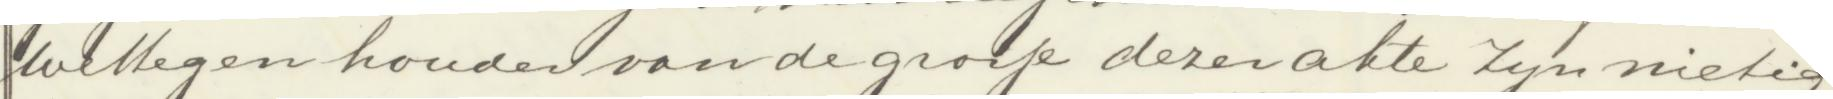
wettigen houder van de grosse dezer akte zyn nietig
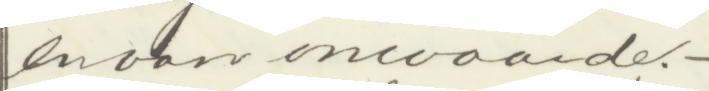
en van onwaarde.-
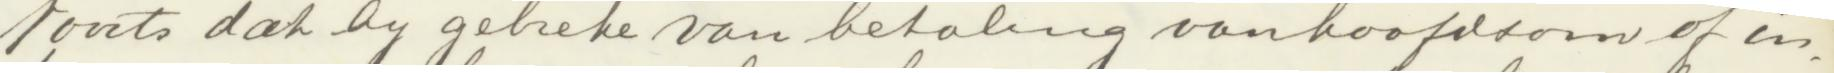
Voorts dat by gebreke van betaling van hoofdsom of in„
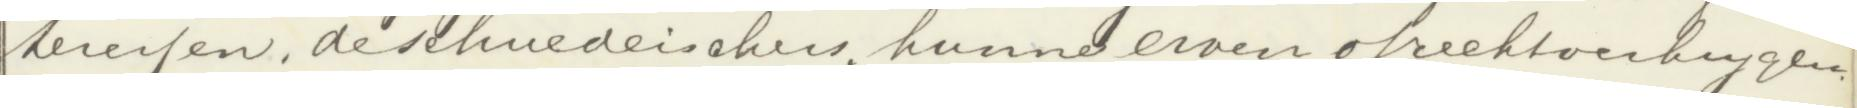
teressen, de schuldeischers, hunne erven of rechtverkrygen,
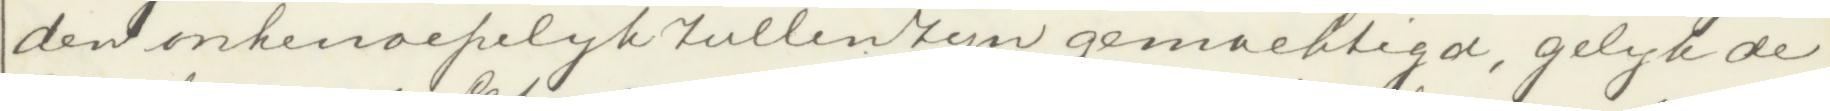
den onherroepelyk zullen zyn gemachtigd, gelyk de
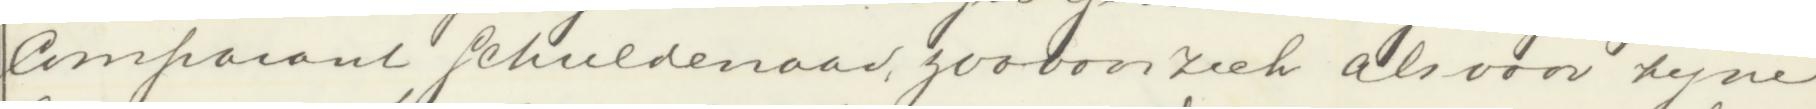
Comparant schuldenaar, zoo voor zich als voor zyne
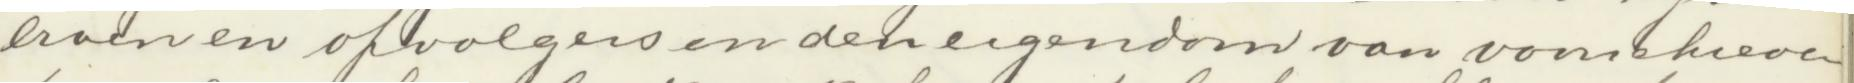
erven en ofvolgers in den eigendom van voorschreven
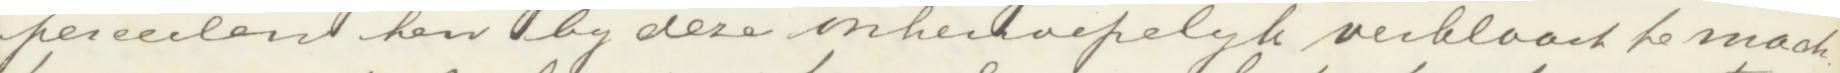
perceelen hen by deze onherroepelyk verklaart te mach
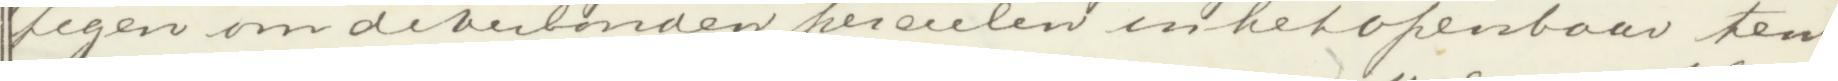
tigen om de verbonden perceelen in het openbaar ten
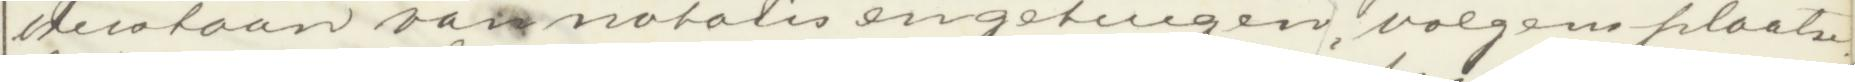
overstaan van notaris en getuigen, volgens plaatse
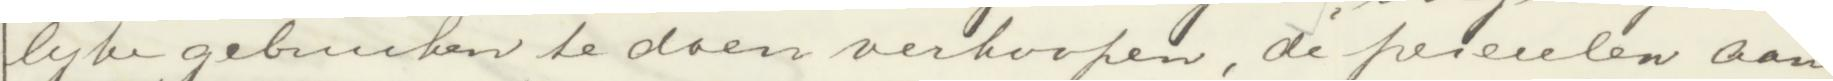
lyke gebruiken te doen verkoopen, de perceelen aan
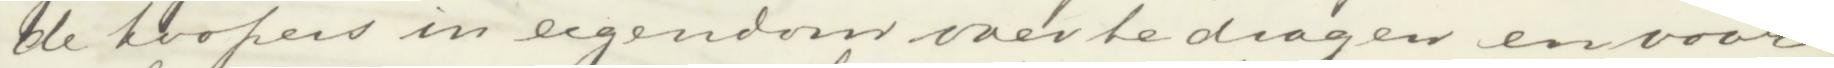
de koopers in eigendom over te dragen en voor
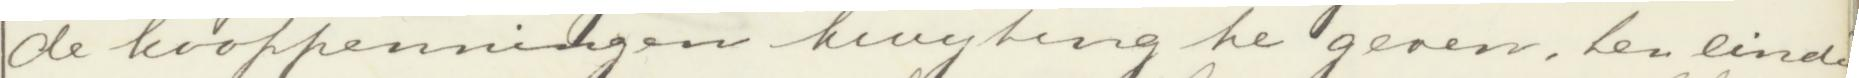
de kooppenningen kwyting te geven, ten einde
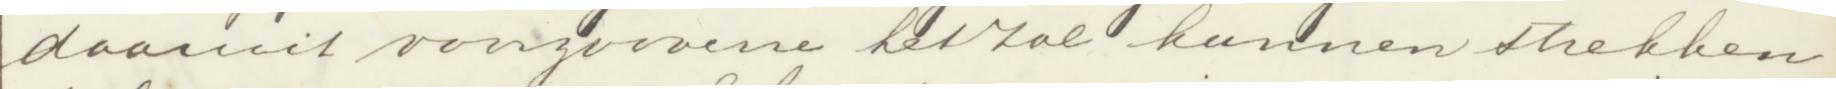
daaruit voorzooverre het zal kunnen strekken
